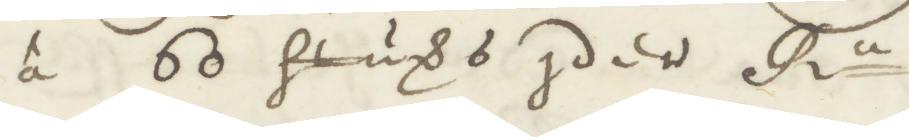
â 60 stuvers jder R=a
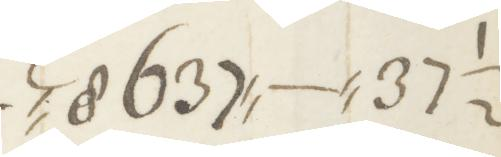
„ 8637„—„37½
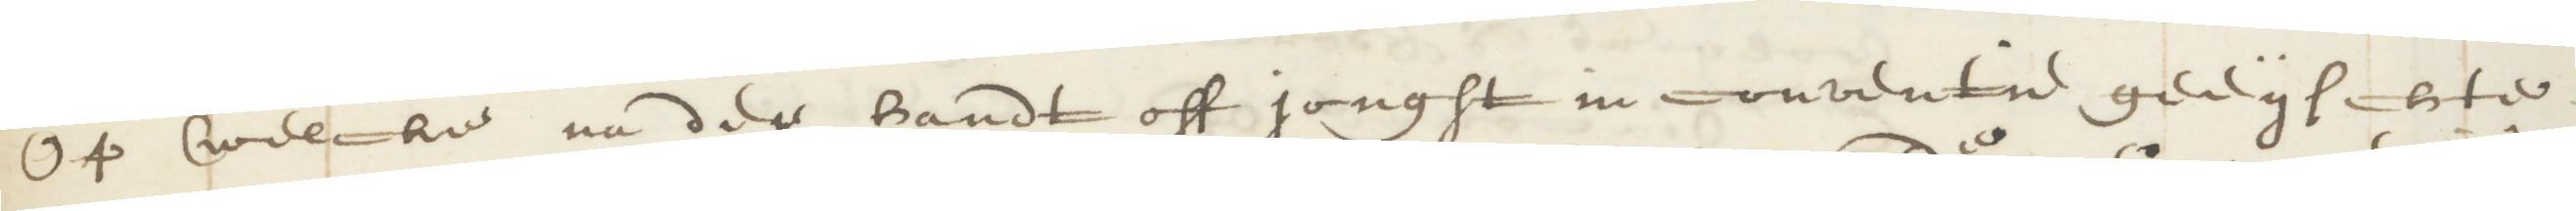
Op welcke na der handt off jongst in conventie geeijschte —
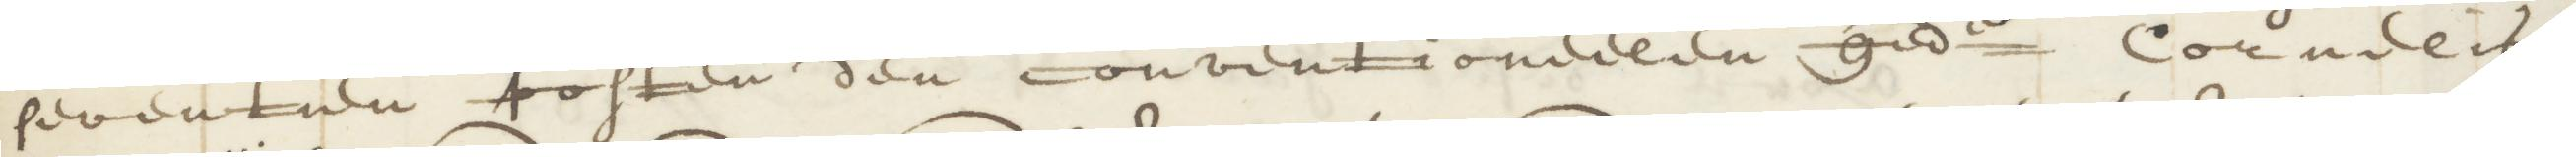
seventien posten den conventioneelen ged=e Cornelis —
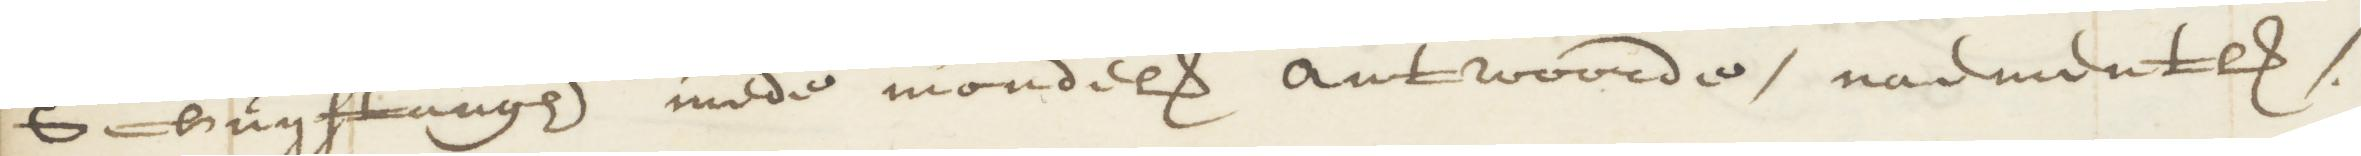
Schuijftangh mede mondel antwoorde / naementl /.
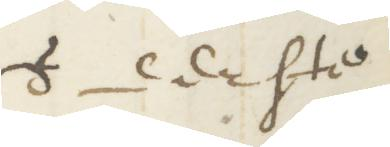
d Eerste
